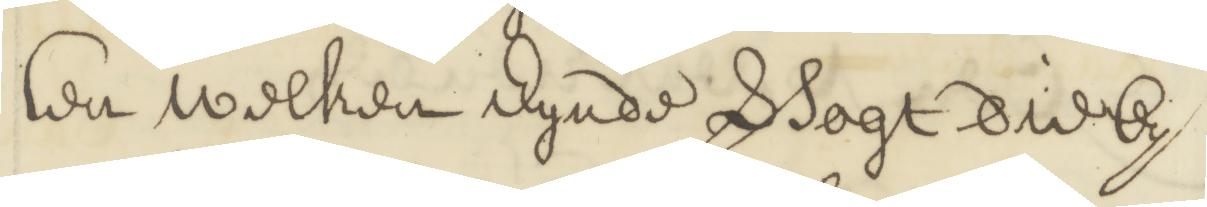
ten welken Eynde versogt die bij
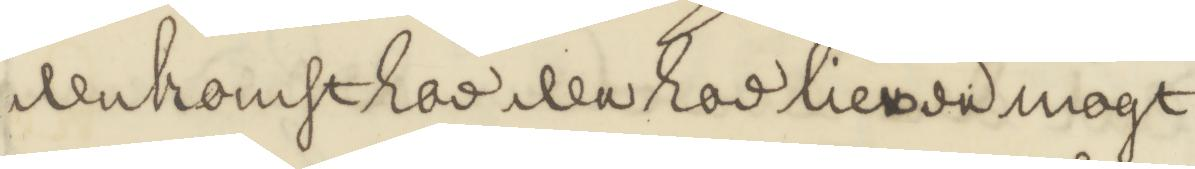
eenkomst hoe eer hoe liever mogt
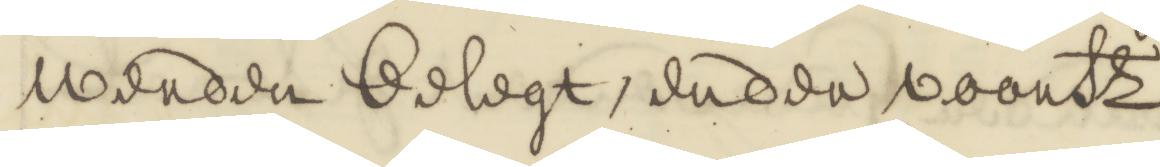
werden belegt, enden voorsz
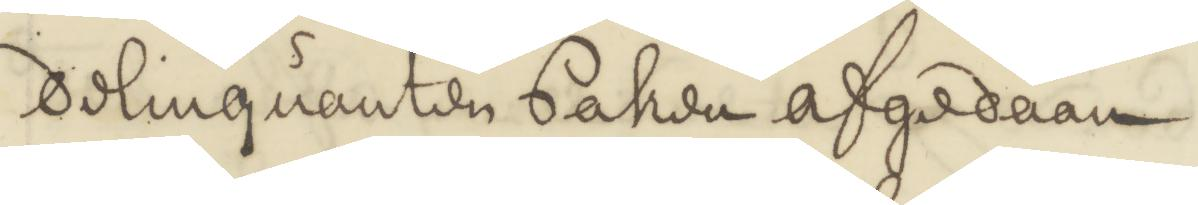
delinquanten saken afgedaan
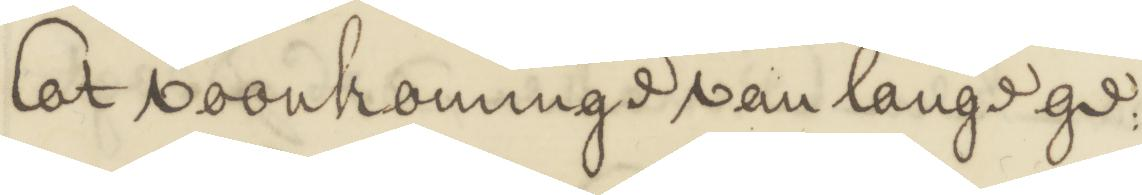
tot voorkominge van lange ge:
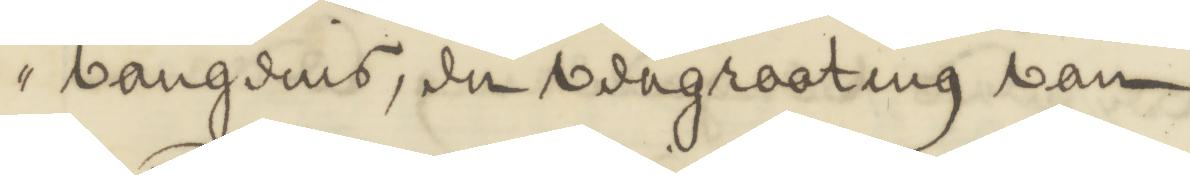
„vangenis, en vergrooting van
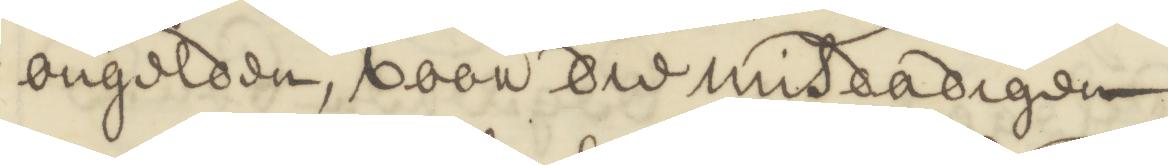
ongelden, voor die misdadigen
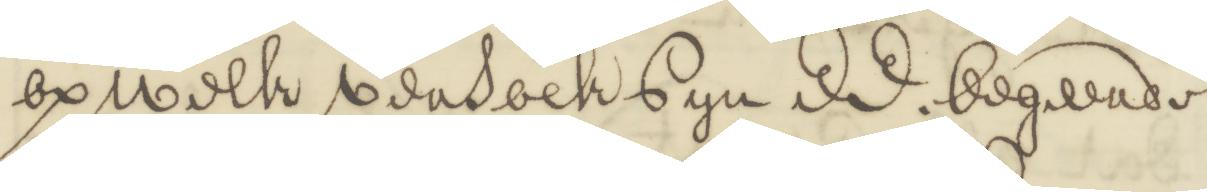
op welk versoek syn EE. begeerde
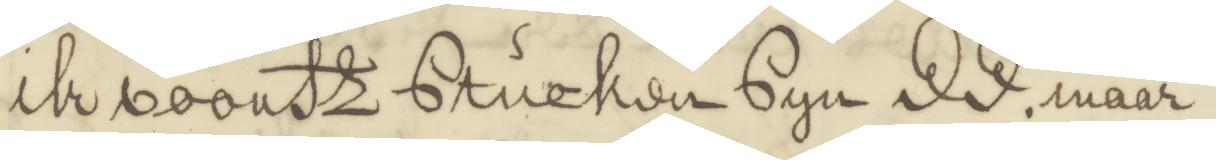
ik voorsz: stucken syn EE. maar
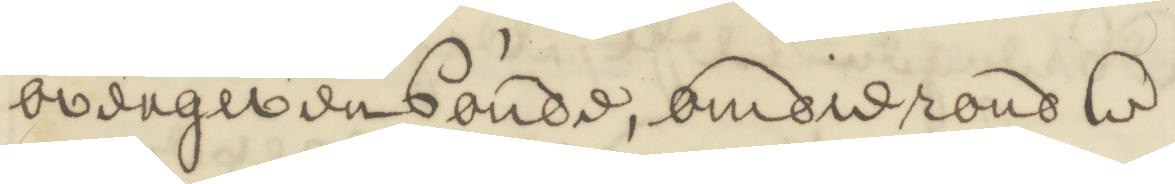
overgeven soude, om die rond te
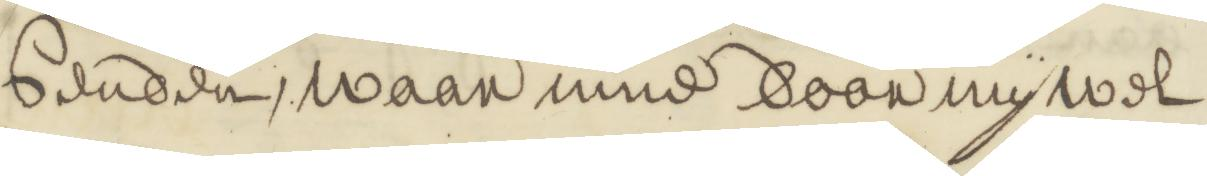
senden; waar inne door mij wel
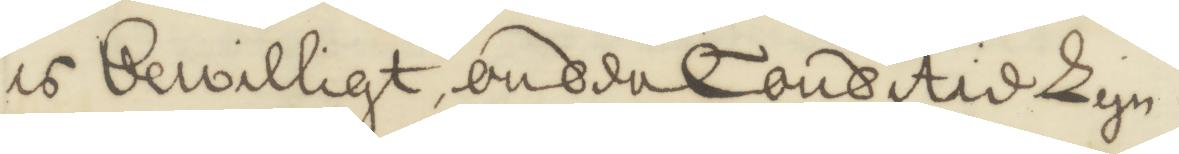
is bewilligt, onder Conditie zijn
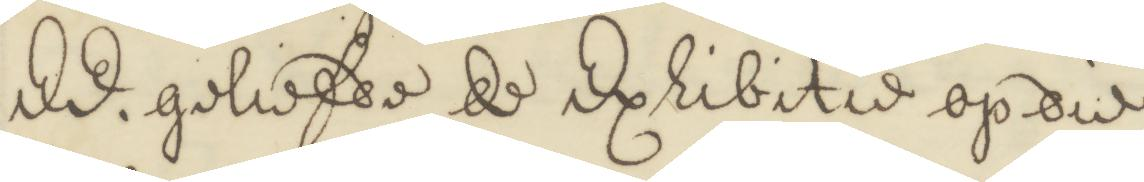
EE. geliefde de Exhibitie op die
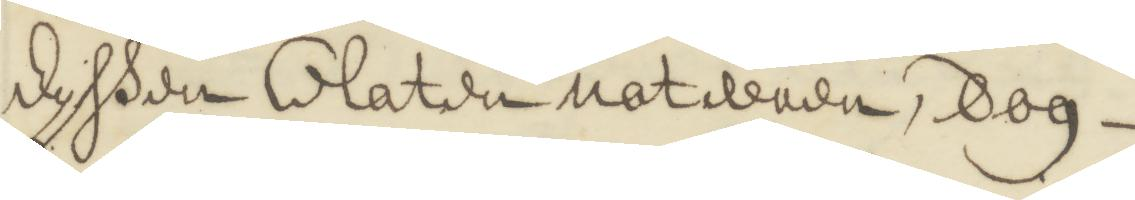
Eyssen te laten noteeren, dog
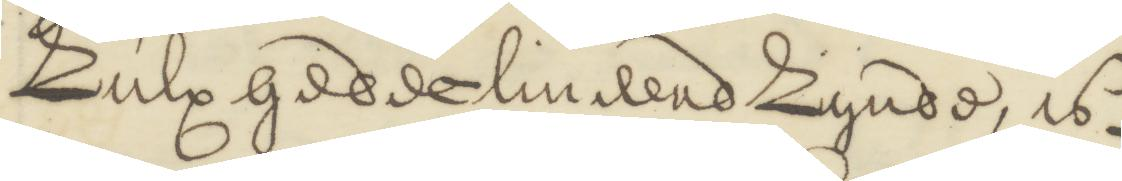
zulx gedeclineerd zijnde, is
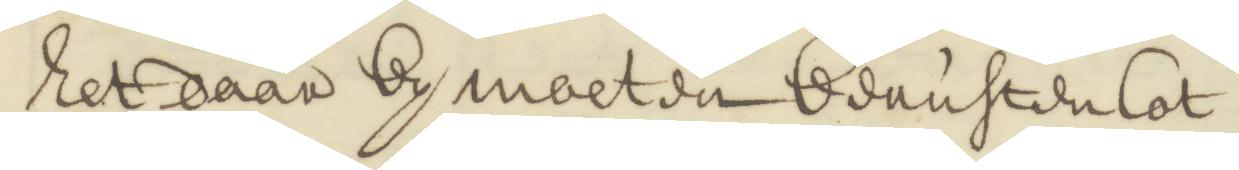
het daar by moeten berusten tot
